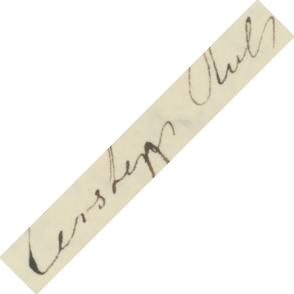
Eersten Rol
